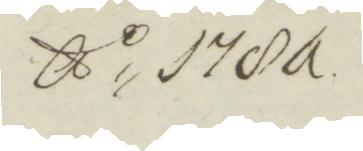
A„o 1784.
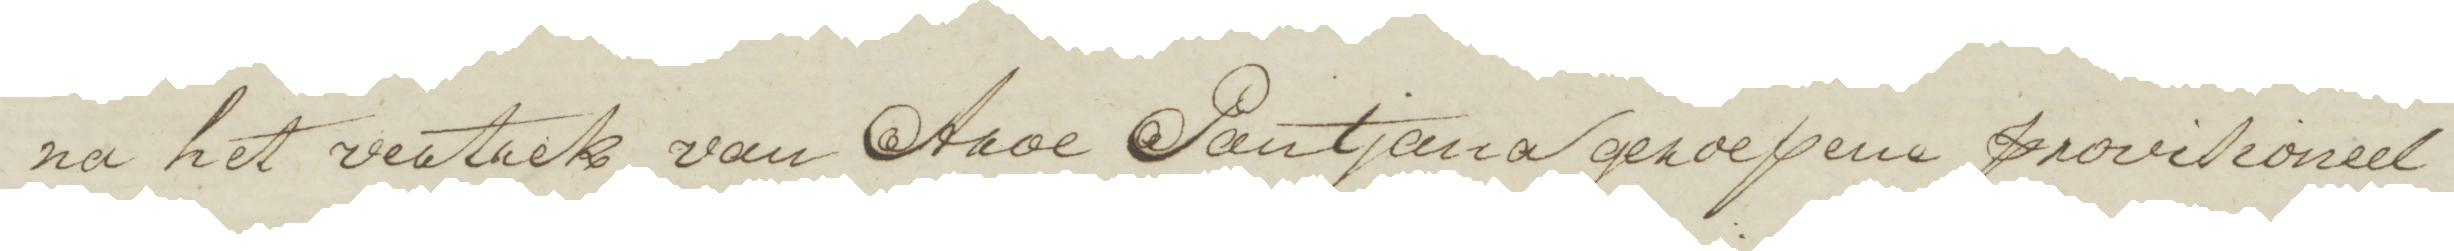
na het vertrek van Aroe Pantjana geroepene provisioneel
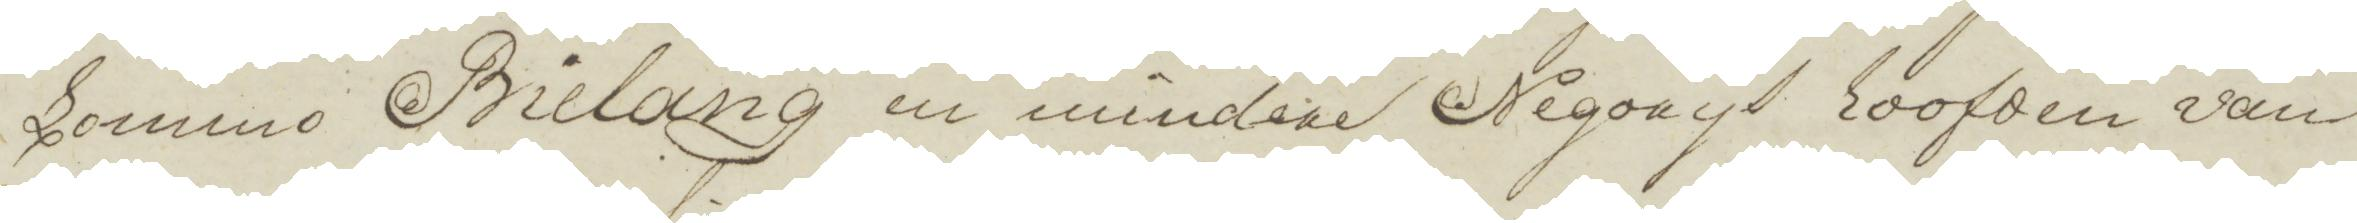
Lommo Bielang en mindere Negorijs hoofden van
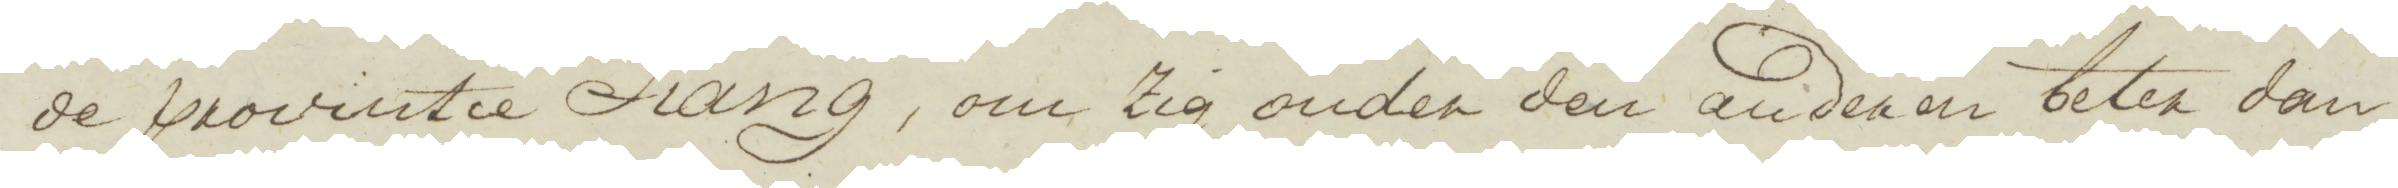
de provintie Siang, om zig onder den anderen beter dan
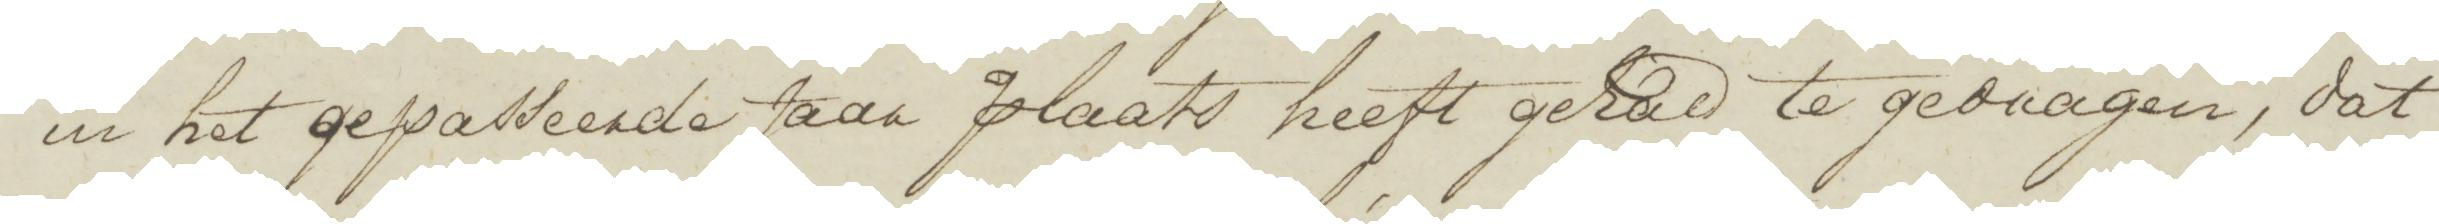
in het gepasseerde Jaar plaats heeft gehad te gedragen, dat
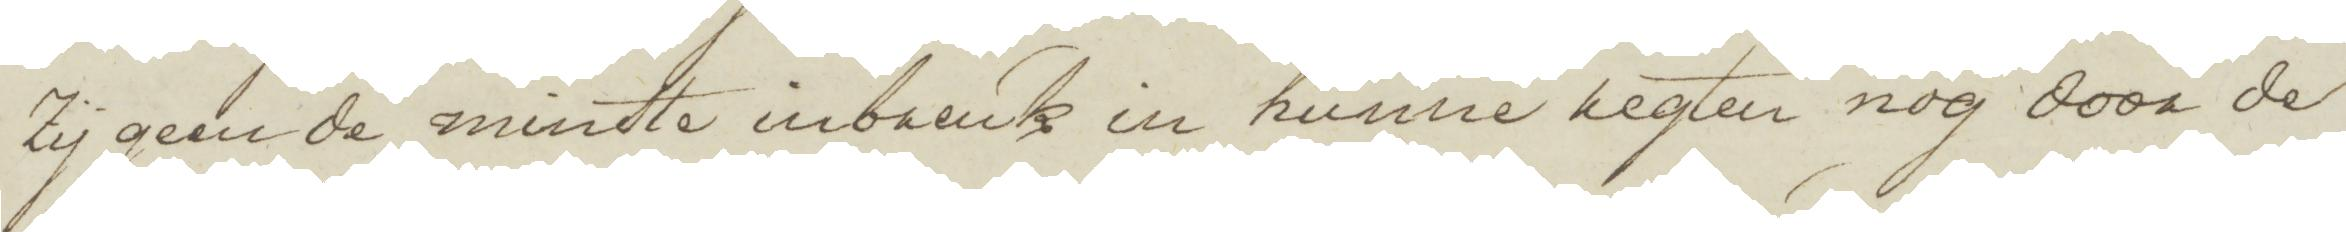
zij geen de minste inbreuk in hunne regten nog door de
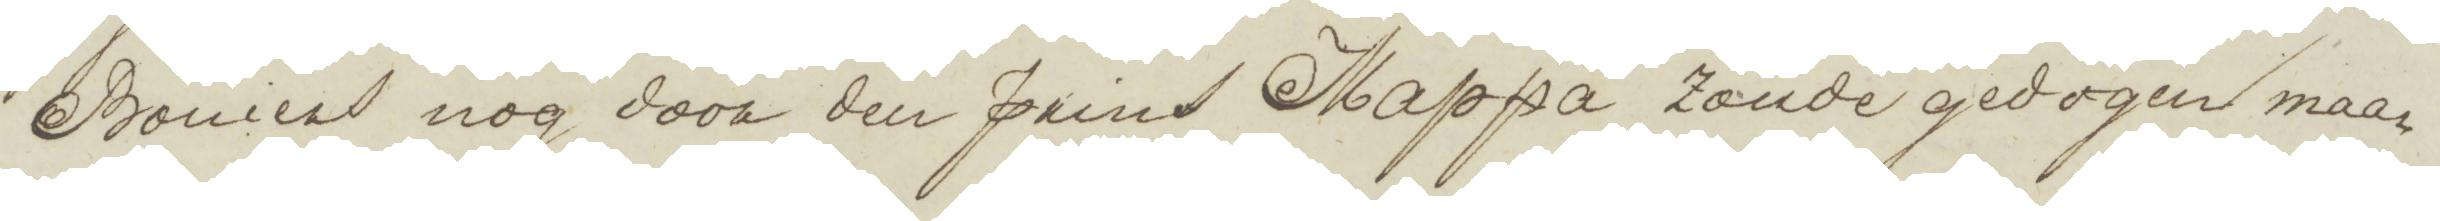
Boniers nog door den prins Mappa zoude gedogen maar
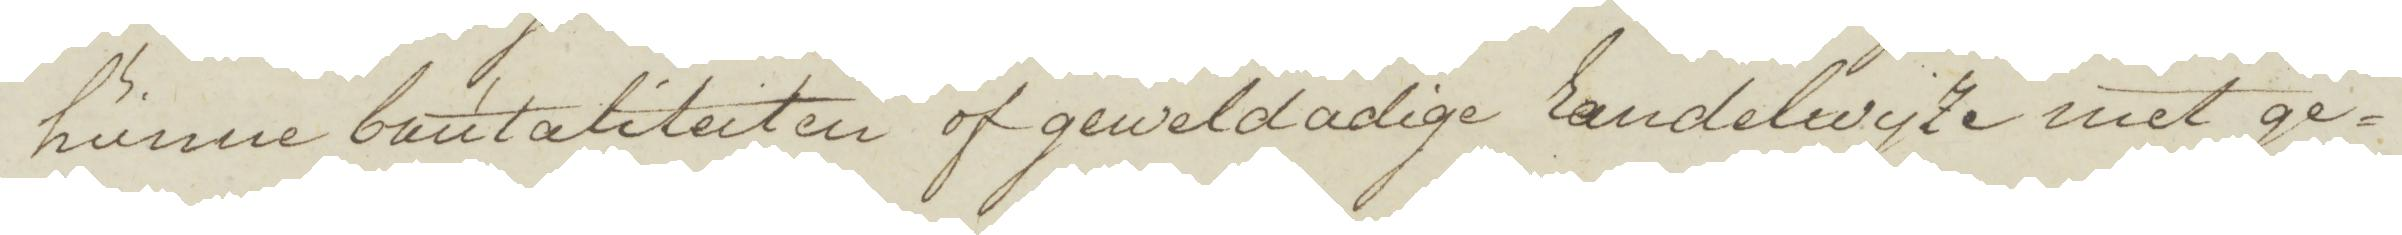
hunne brutaliteiten of geweldadige handelwijze met ge=
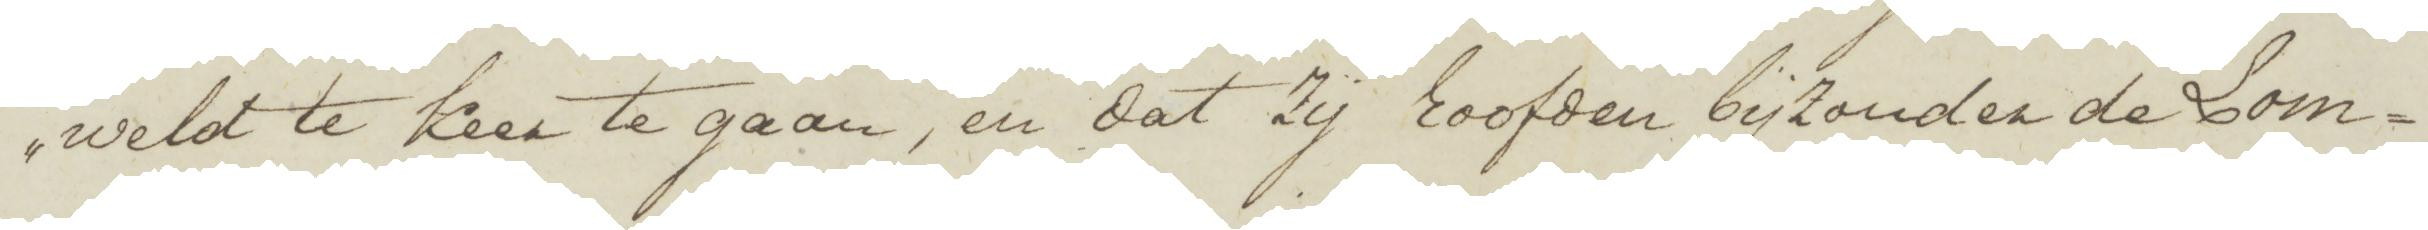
„weld te keer te gaan, en dat zij hoofden bijzonder de Lom=
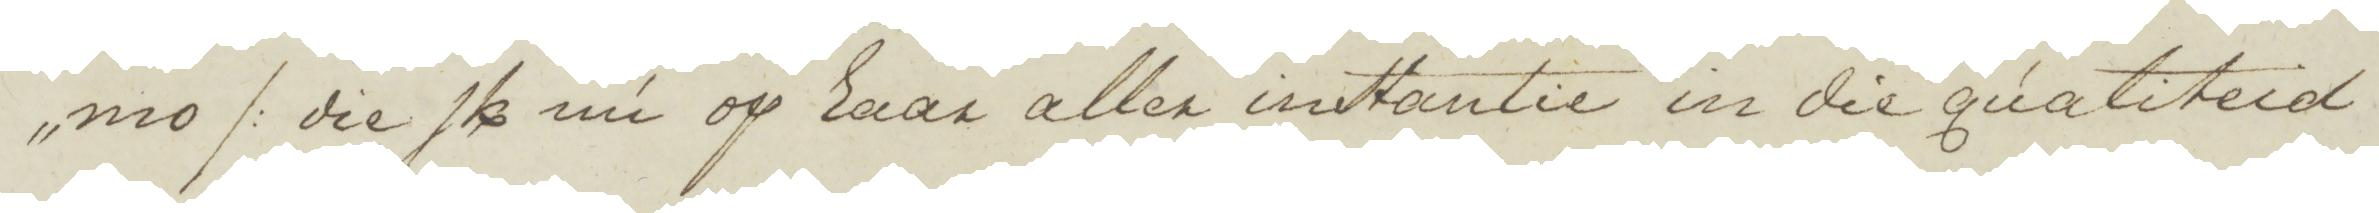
„mo /: die jk nu op haar aller instantie in die qualiteid
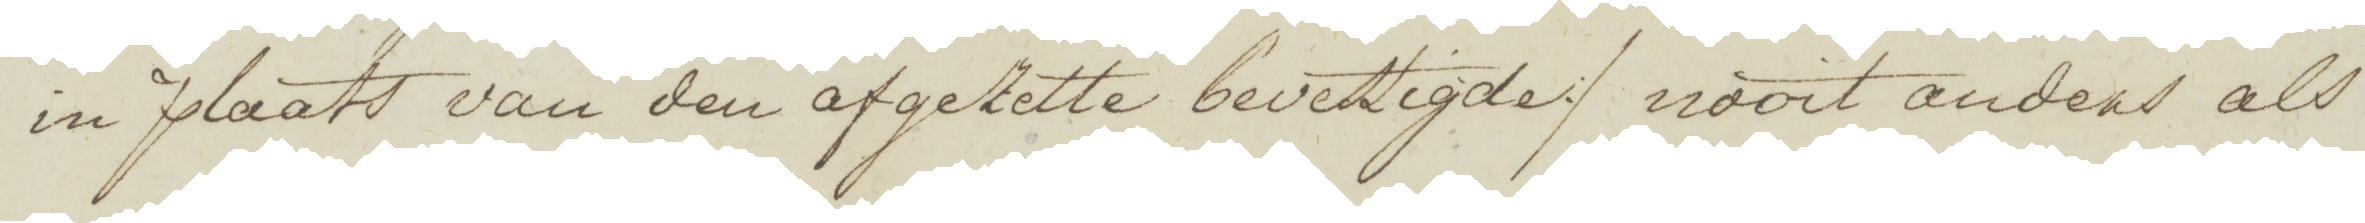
in plaats van den afgezette bevestigde:/ nooit anders als
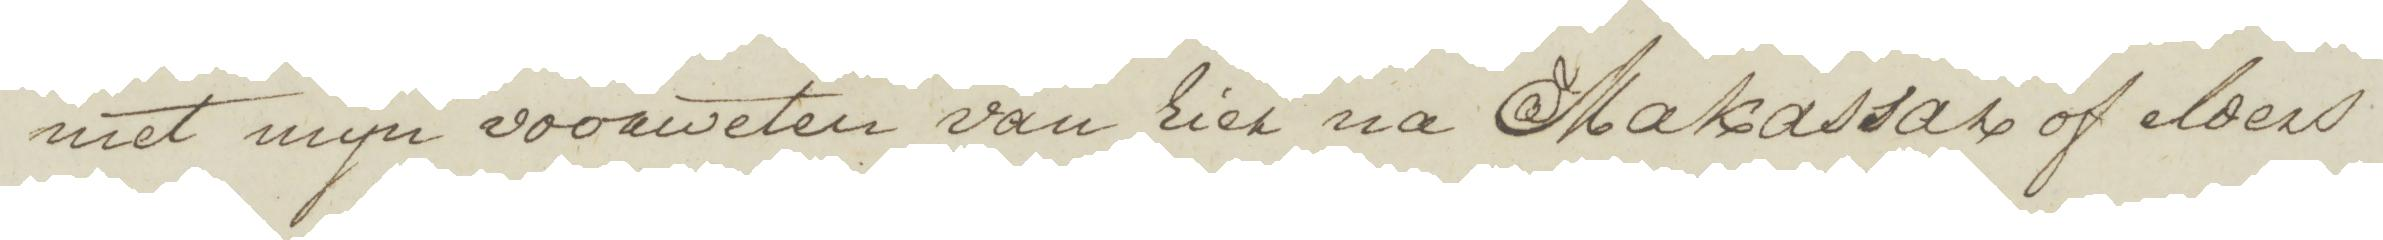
met mijn voorweten van hier na Makassar of elders
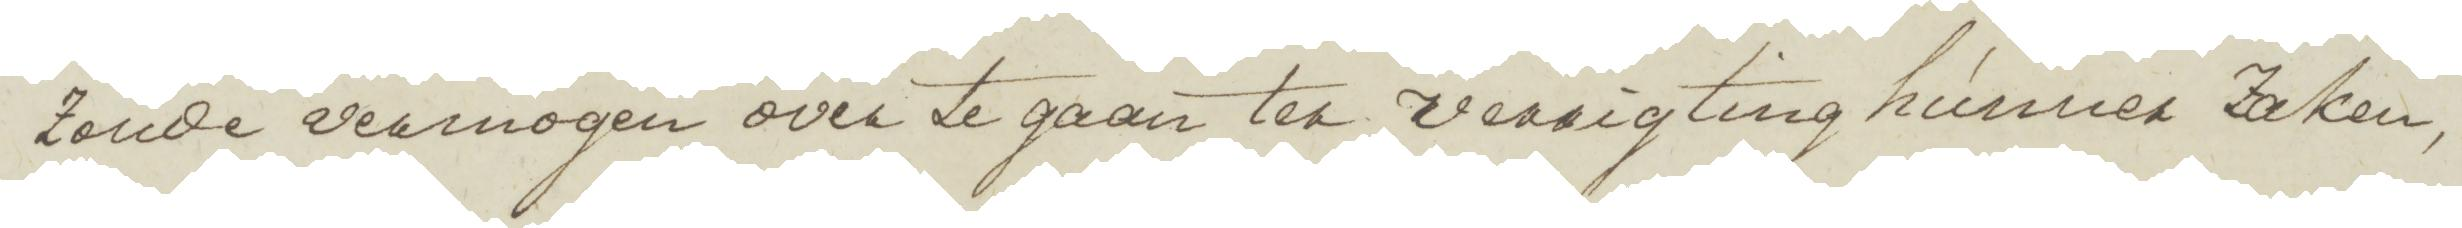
zoude vermogen over te gaan ter verrigting hunner zaken,
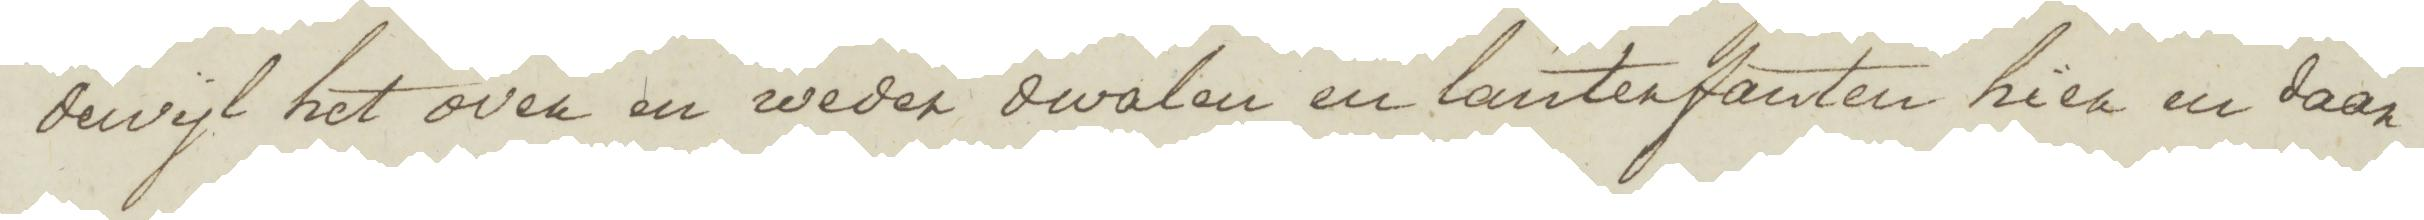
dewijl het over en weder dwalen en lanterfanten hier en daar
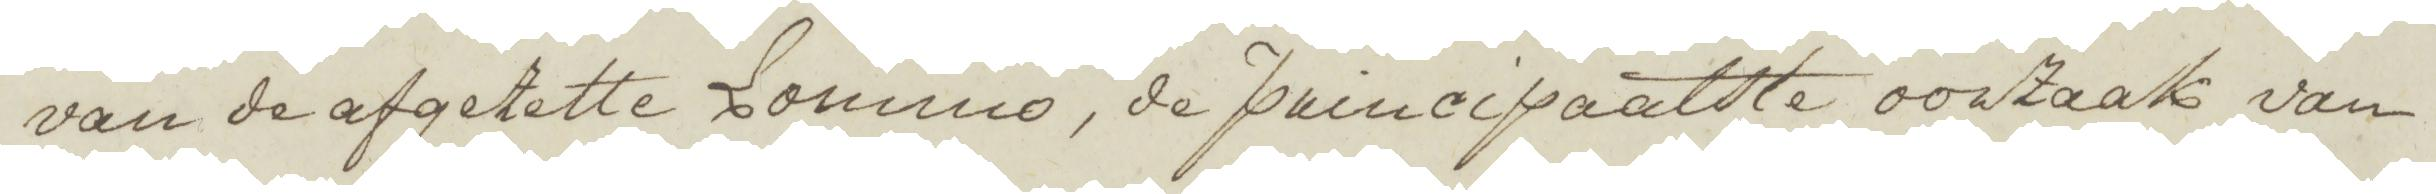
van de afgezette Lommo, de principaalste oorzaak van
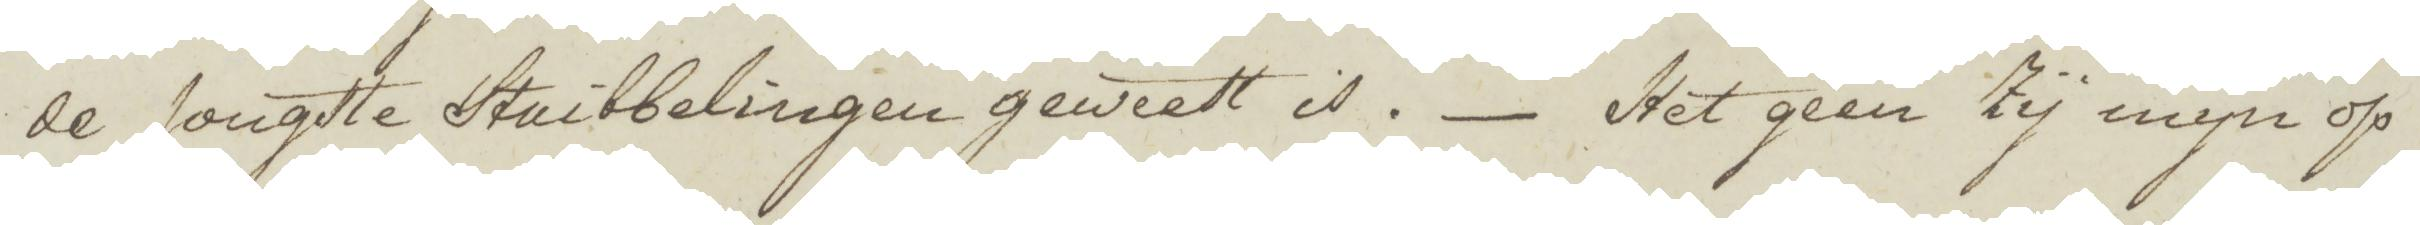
de jongste stribbelingen geweest is. — Het geen zij mijn op
